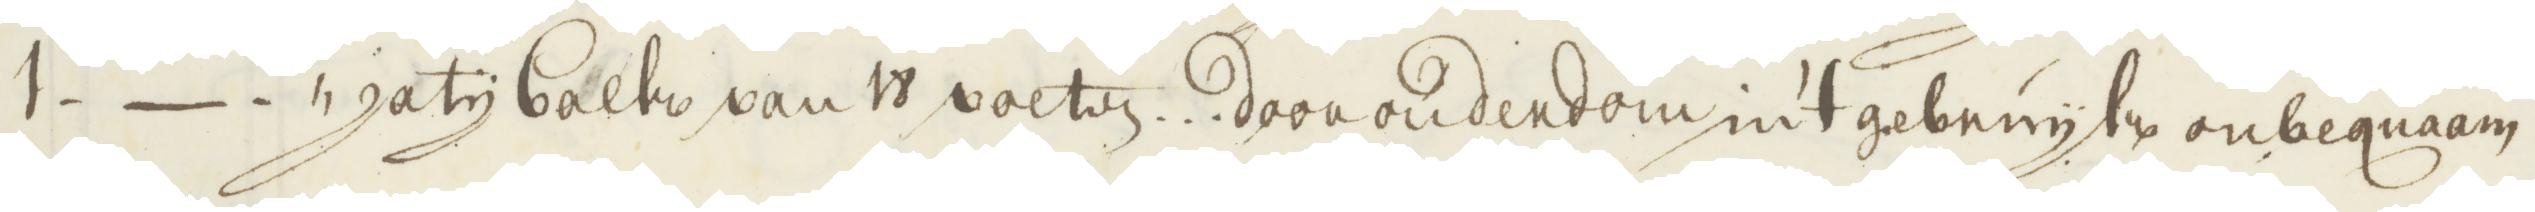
1- — - „ jatijbalk van 18 voeten . . . door onderdom in ’t gebruijk onbequaam
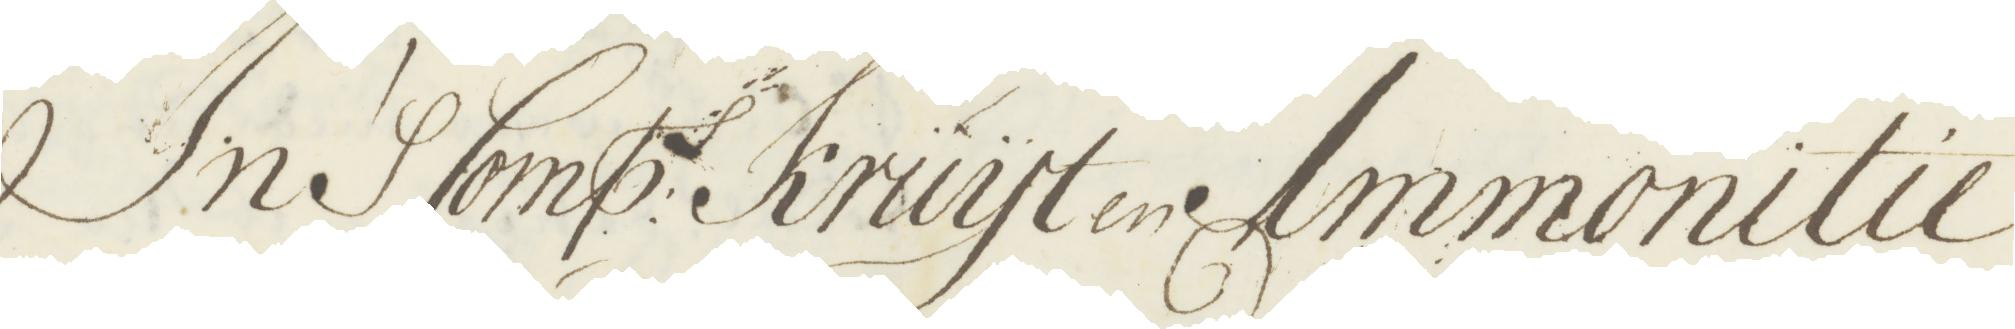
In 's Comp:s kruijt en Ammonitie
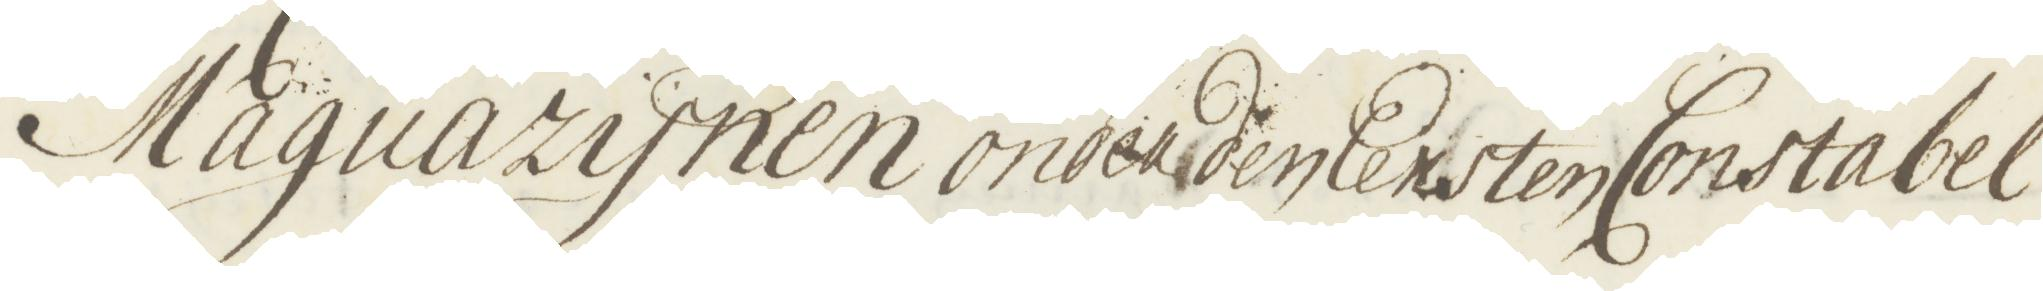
Maguazijnen onder den Eersten Constabel
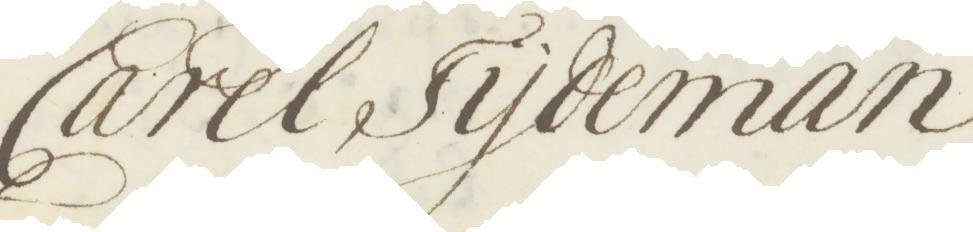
Carel Tijdeman
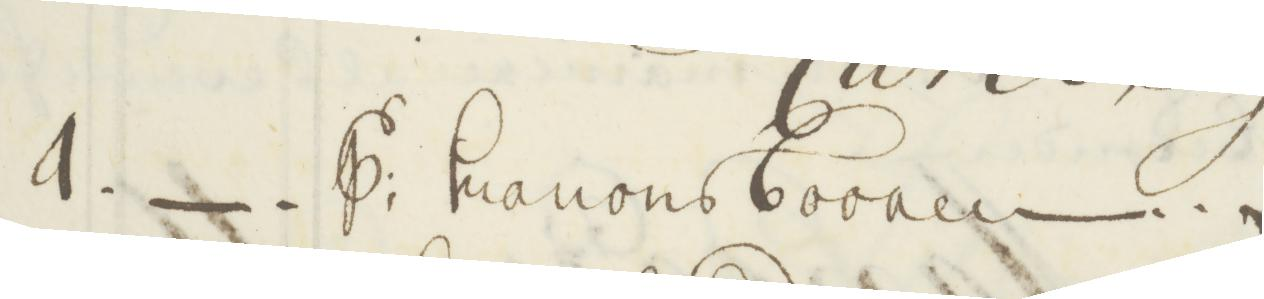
4- — - P;s kanonsbooren. .
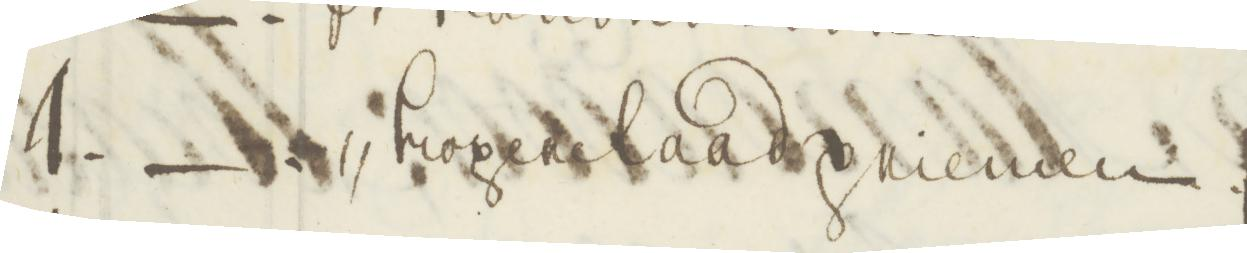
4- — - „ kopere laad priemen .
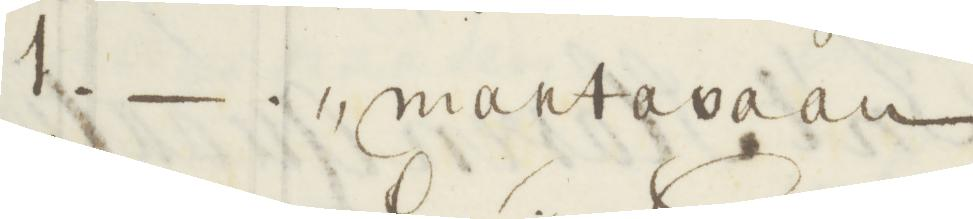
1- — - „ martavaan. . . . .
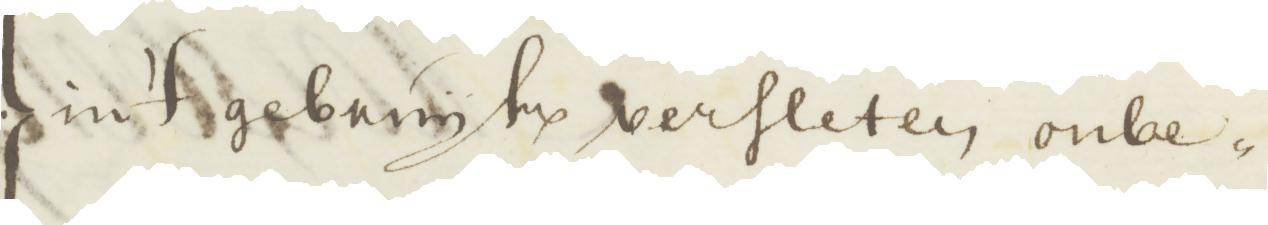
in 't gebruijk versleten onbe„
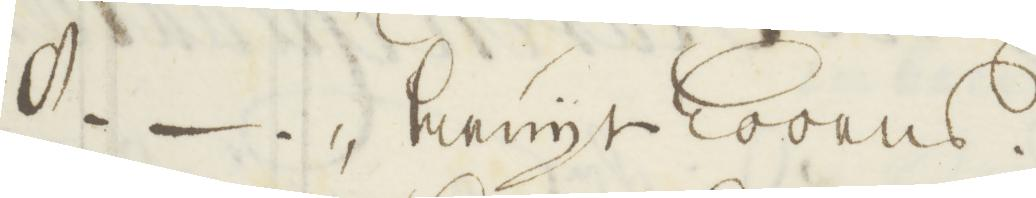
8- — - „ kruijt hoorns . . . .
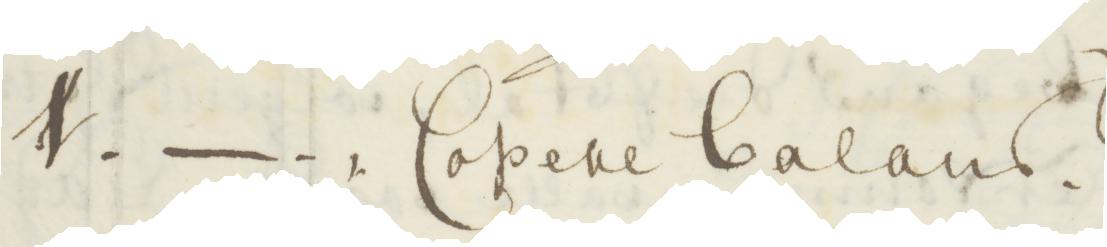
1- — - „ Copere balans .
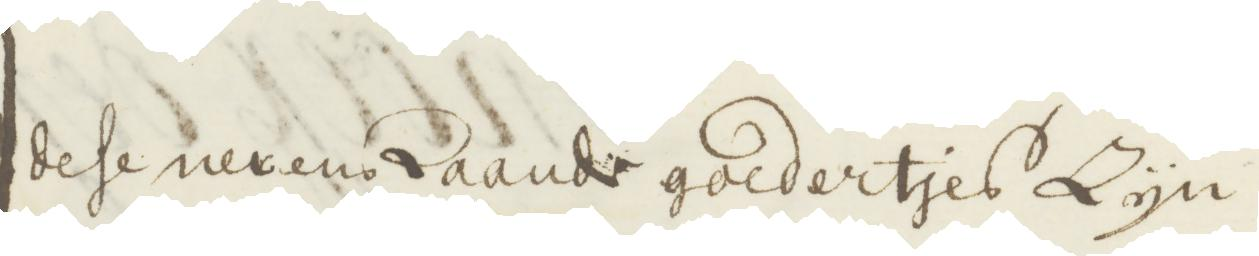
dese nevenstaande goedertjes zijn
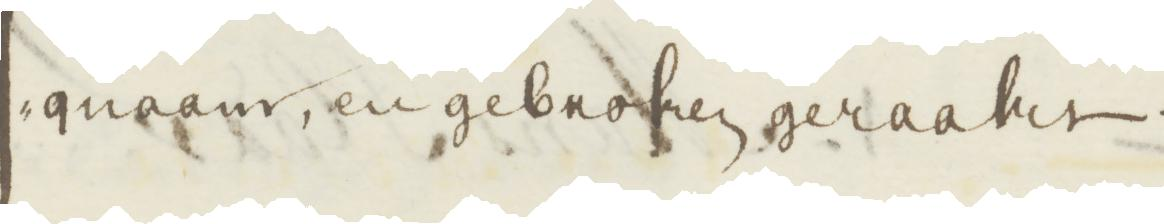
„quaam, en gebroken geraakt
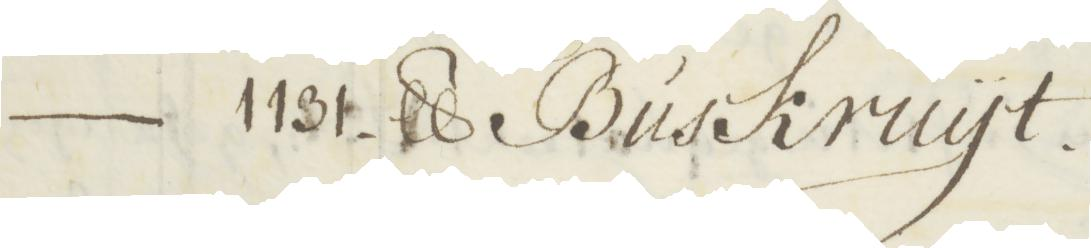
— 1131 - lb Buskruijt .
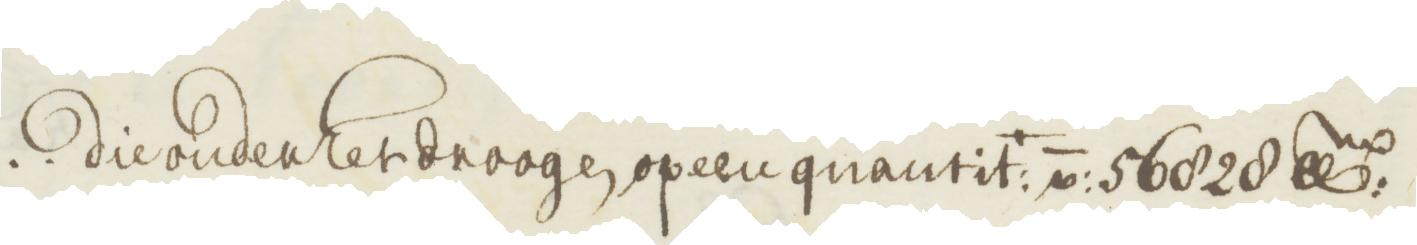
die onder het droogen op een quantit:t v: 56828 lb:
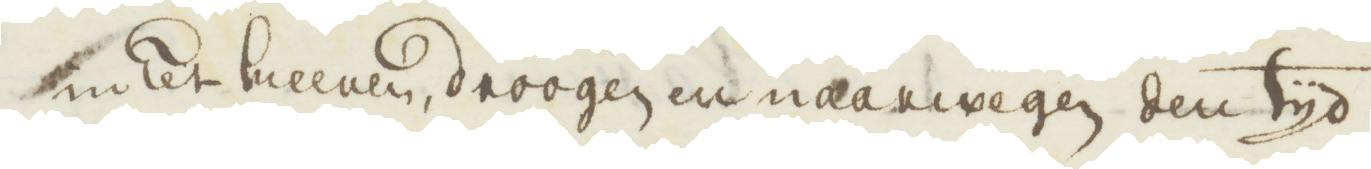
in het keeren, droogen en naarwegen den tijd
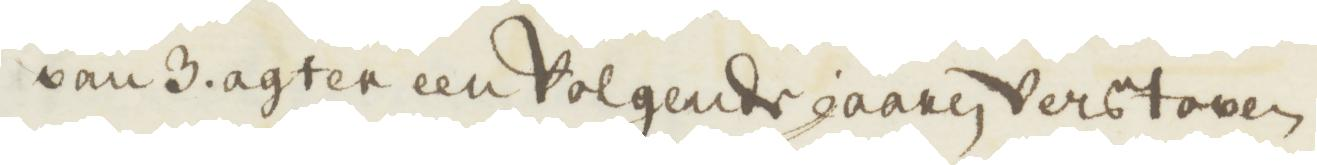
van 3. agter een Volgende jaaren Verstoven
